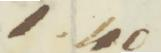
1. 40
